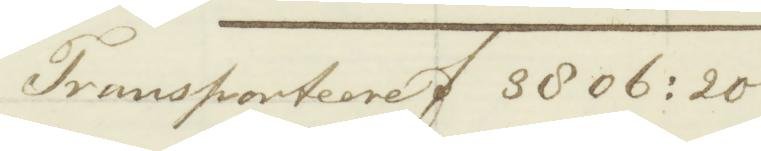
Transporteere ƒ 3806: 20
